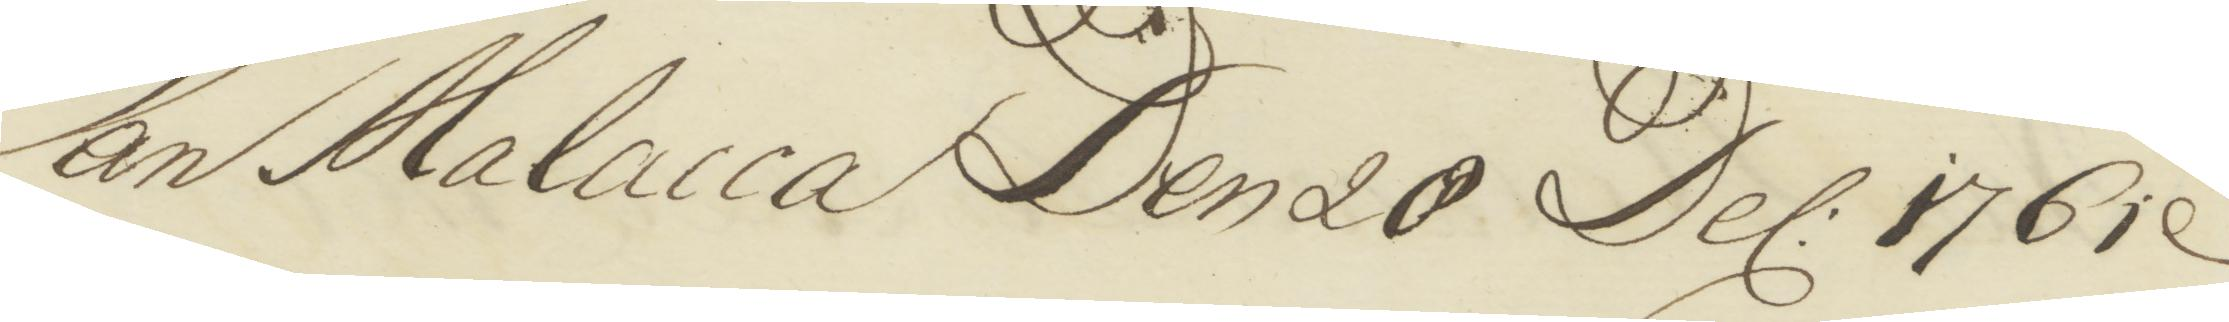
Van Malacca Den 28 Dec: 1761
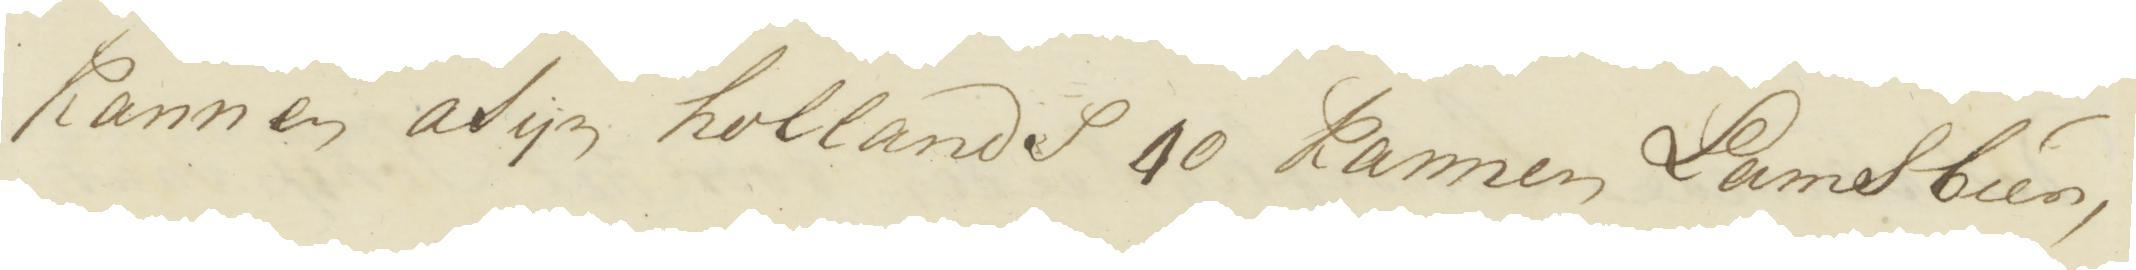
kannen asijn hollands 40 kannen Lamsbier,
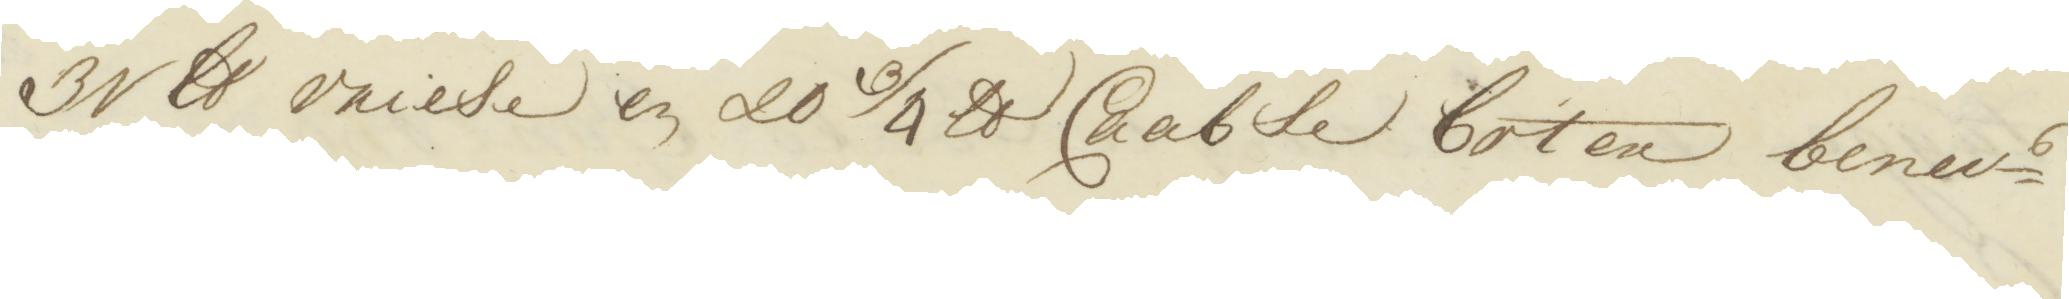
31 lb vriese en 20 ¾ lb Caabse boten benev=s
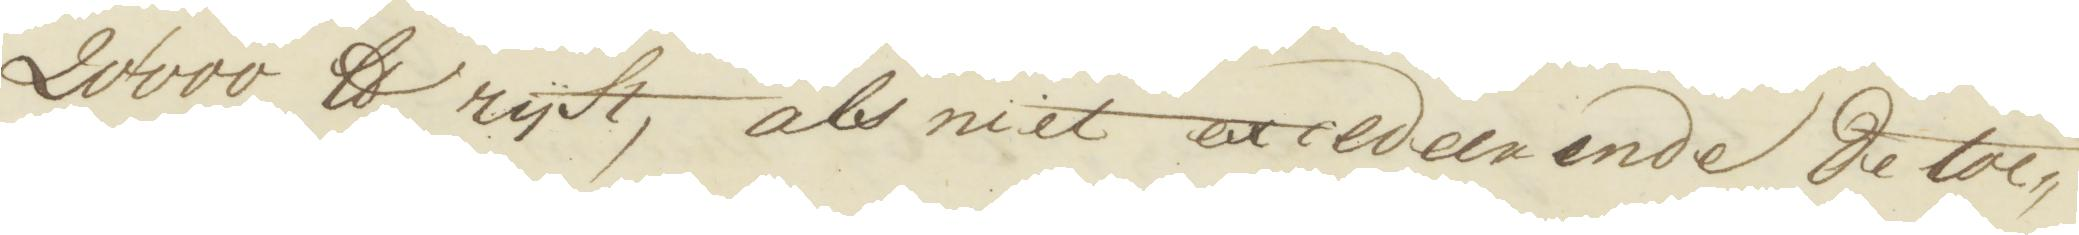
20'000 lb rijst, als niet excedeerende de toe„
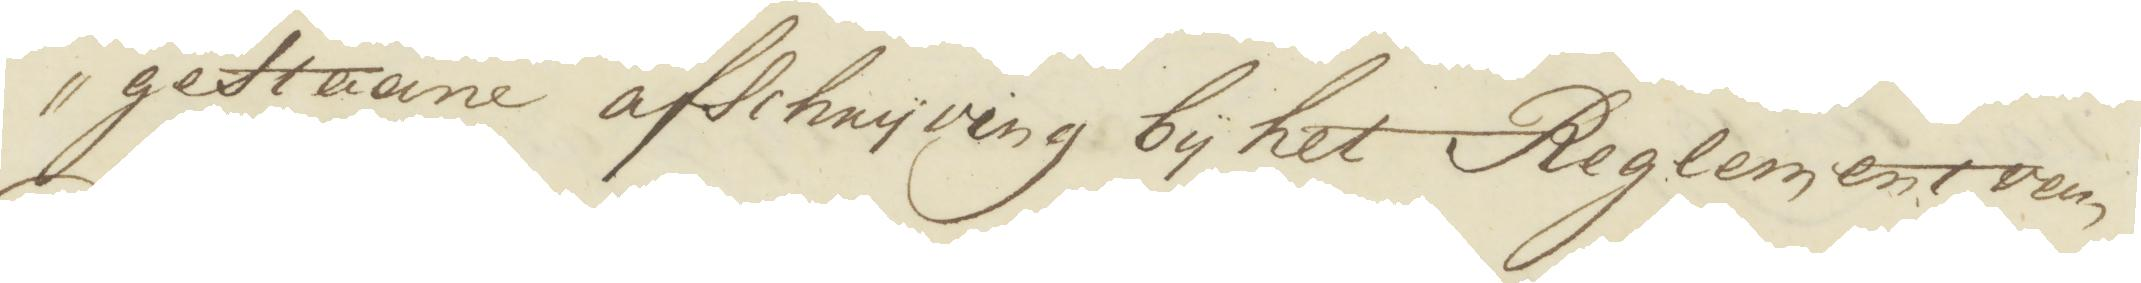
„gestaane afschrijving bij het Reglement van
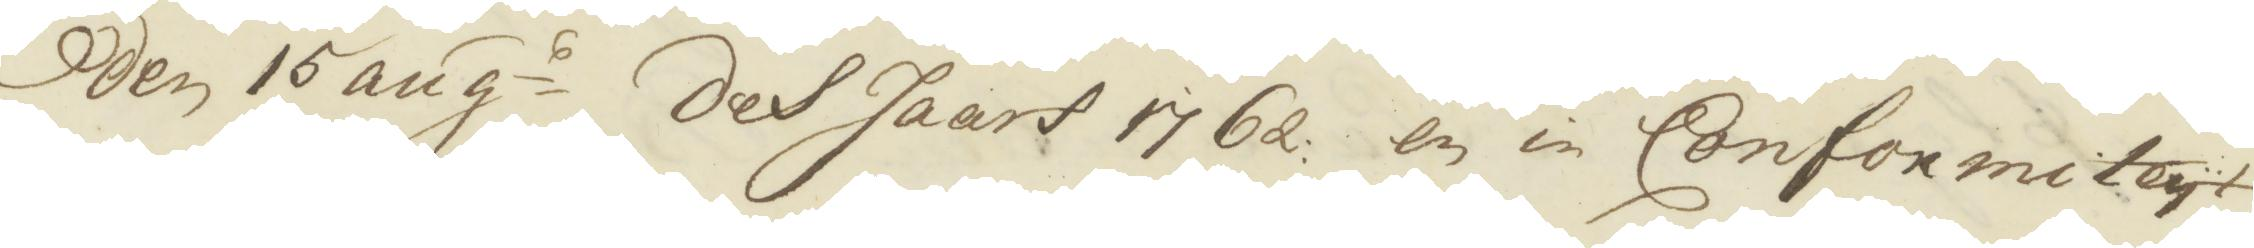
den 15 aug=s des Jaars 1762: en in Conformiteijt
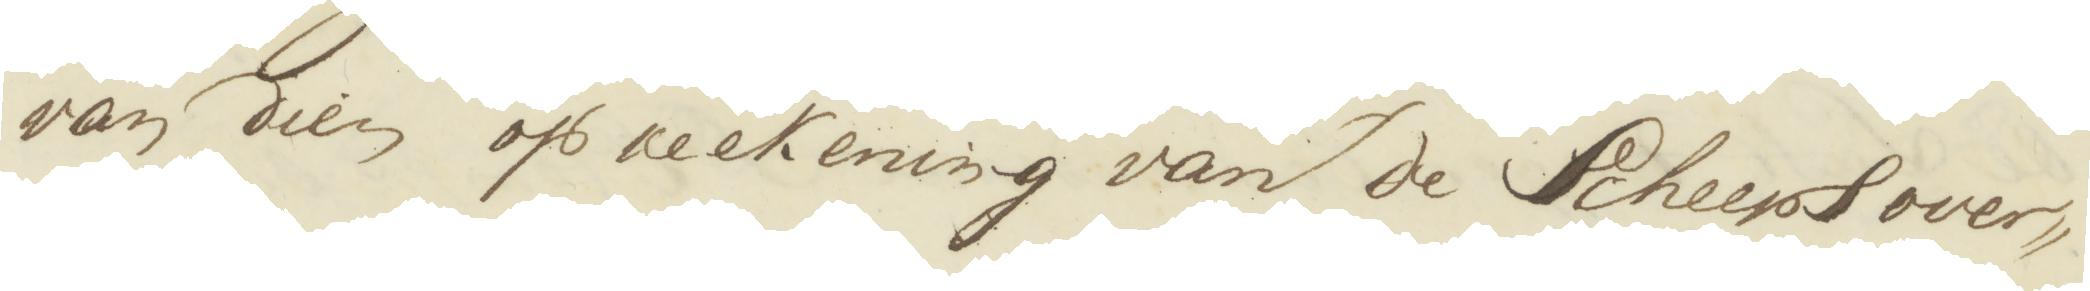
van dien op reekening van de scheepsover„
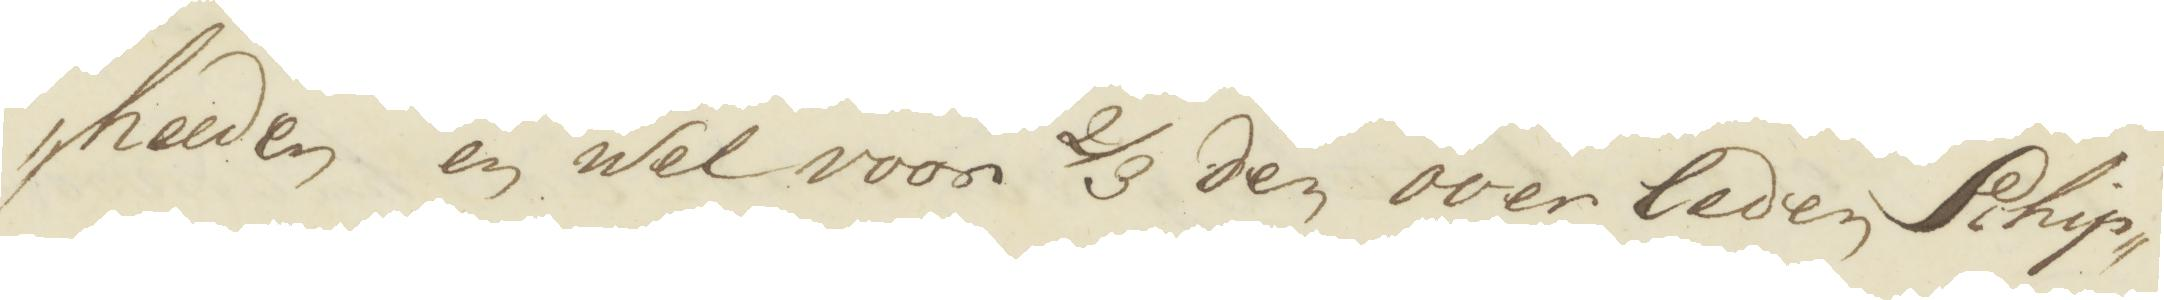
heeden en wel voor 2/3 den overleden schip„
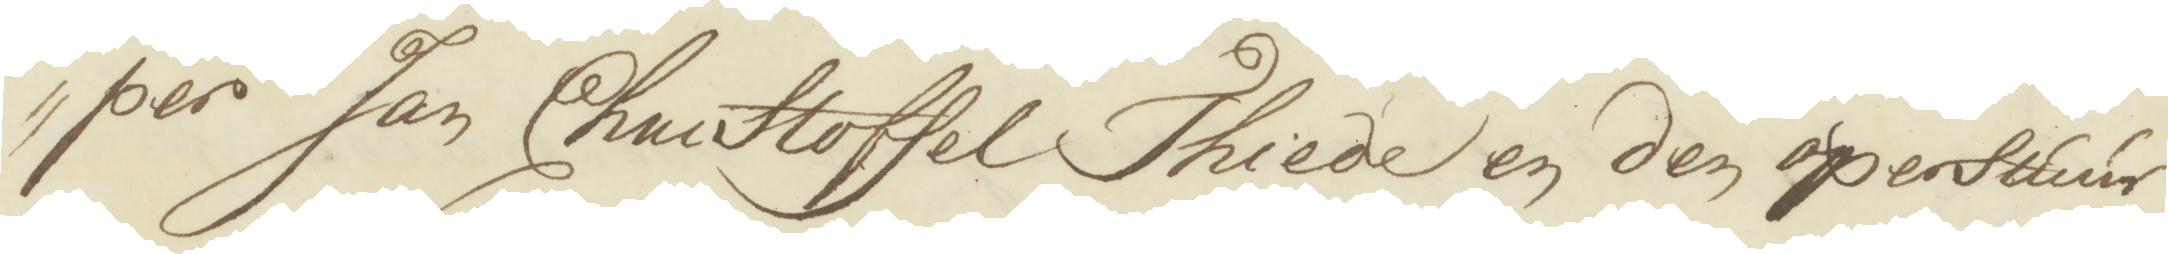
„per Jan Christoffel Thiede en den opperstuur
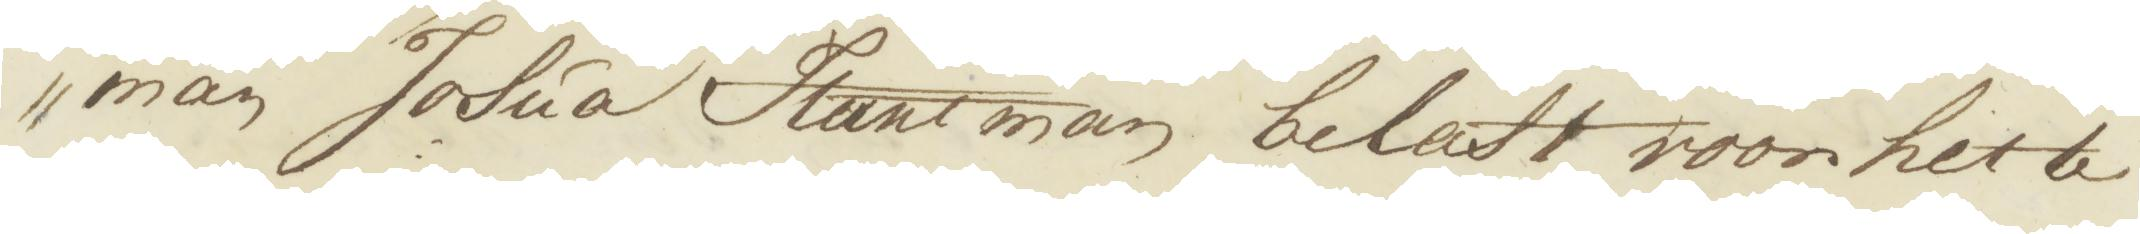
„man Josua Stuntman belast voor het te
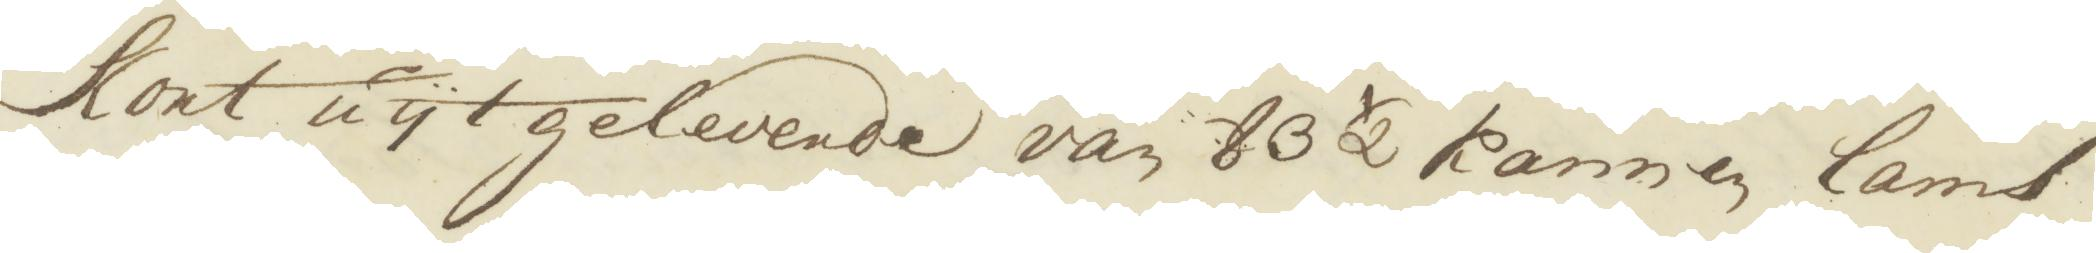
kort uijtgeleverde van 83½ kannen lams
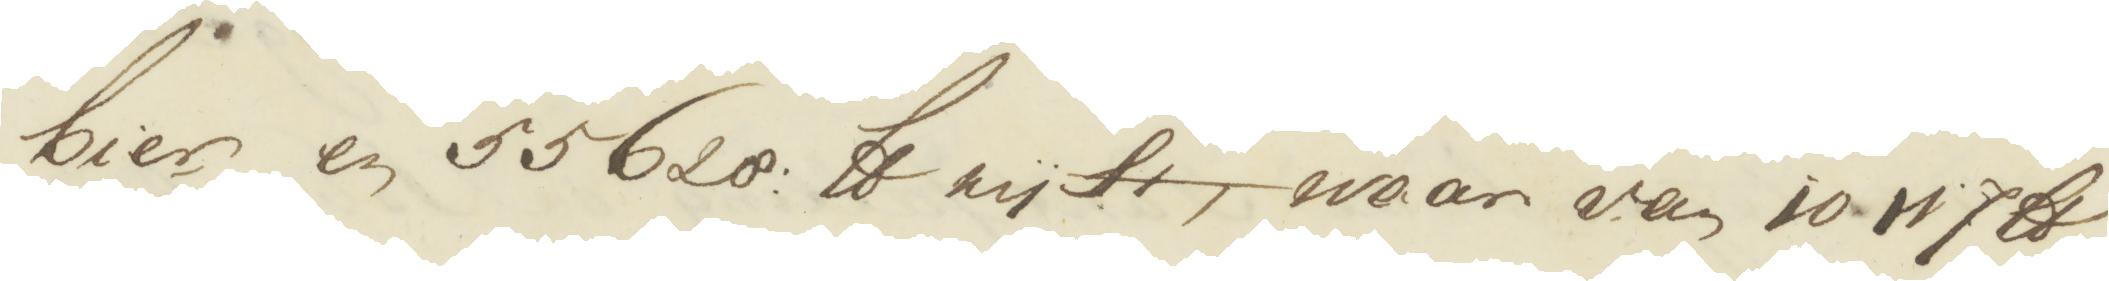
bier en 55628: lb rijst, waarvan 10117 lb
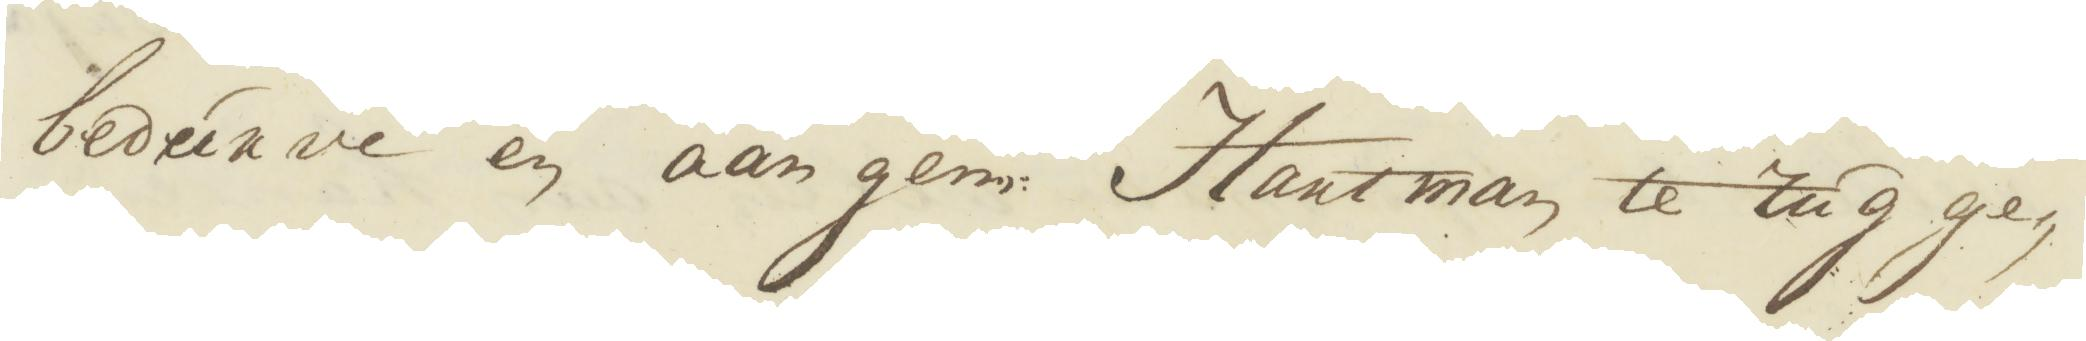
bedurve en aan gem: Hartman te rug ge„
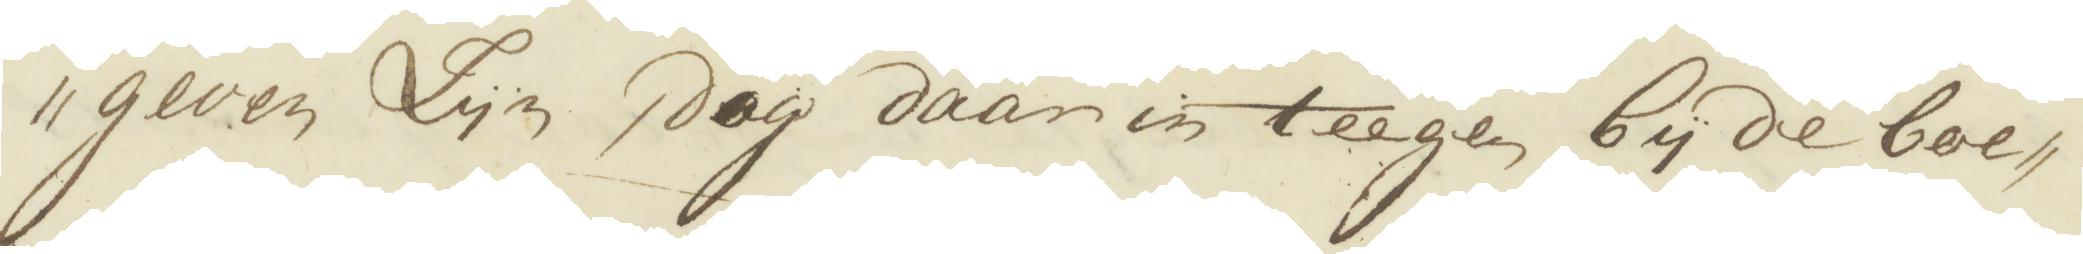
„geven zijn, dog daar in teegen bij de boe„
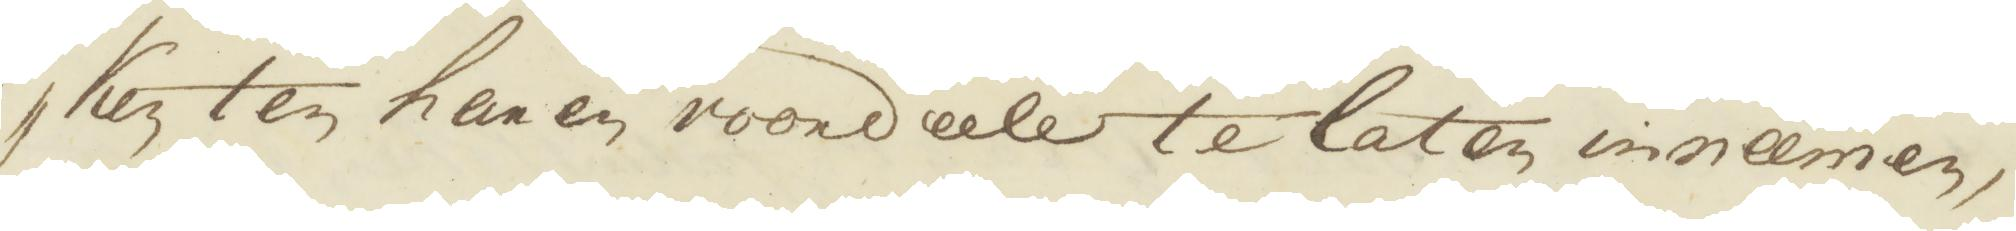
„ken ten haren voordeele te laten in neemen,
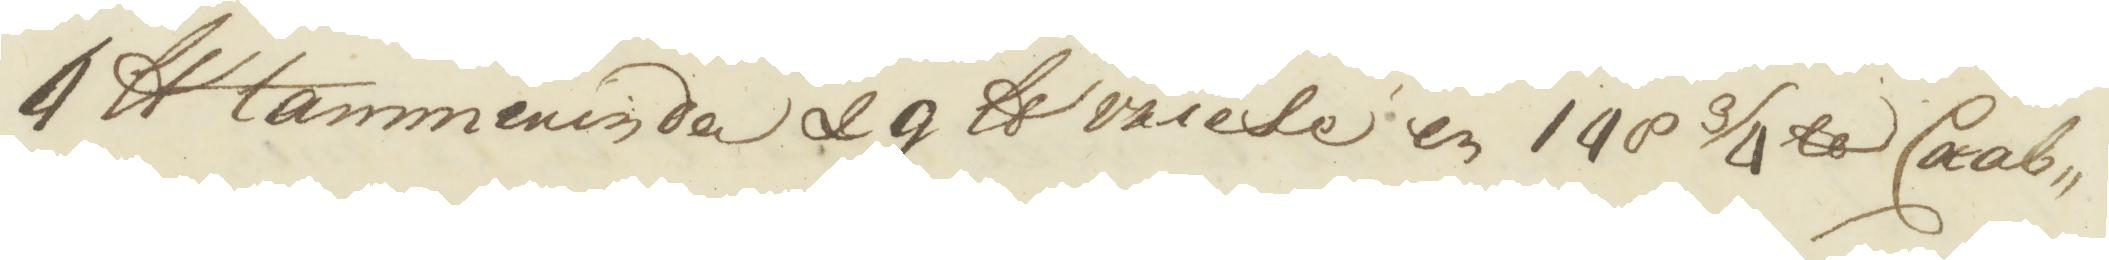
4 lb tammerinde 29 lb vriese en 148¾ lb Caab„
